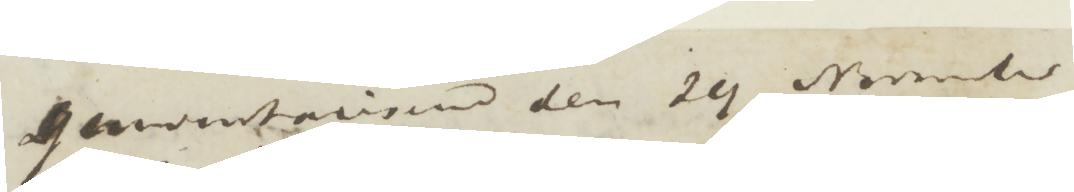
Geinventariseerd den 29 November
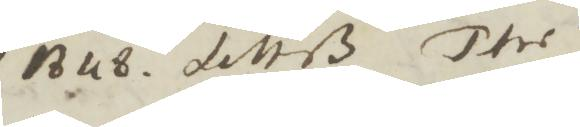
1848. Litt B PM
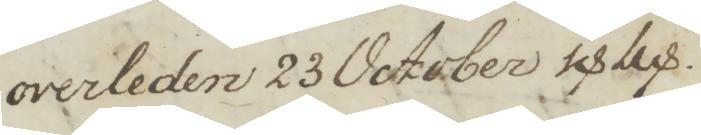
overleden 23 October 1848.
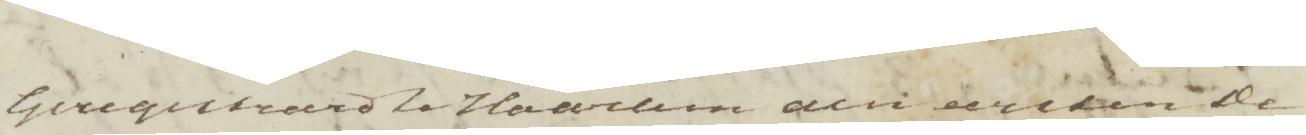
Geregistreerd te Haarlem den eersten de
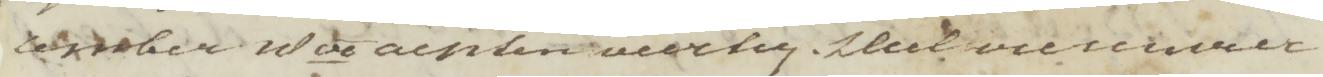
cember 1800 achten veertig Deel vierenveer
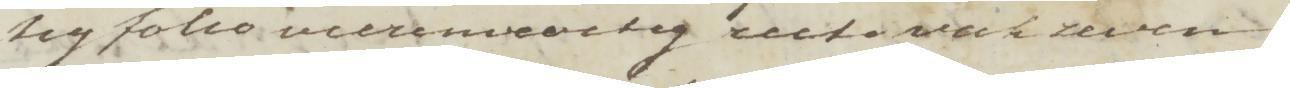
tig folio vierenveertig recto vak zeven
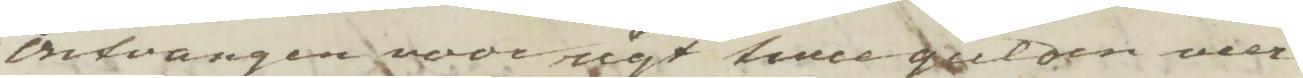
ontvangen voor regt twee gulden veer
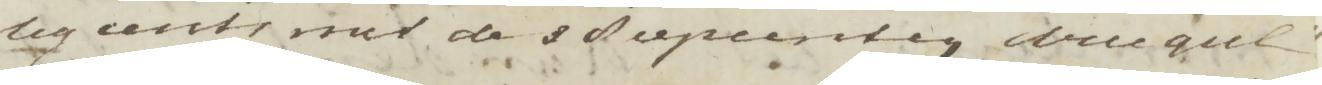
tig cents met de 38 opcenten drie gul
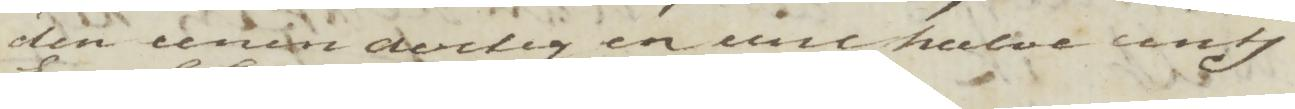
den eenen dertig en een halve cents
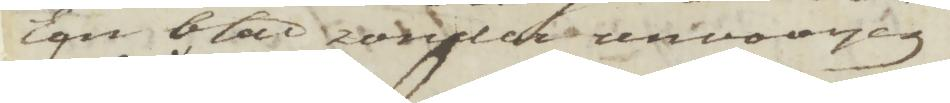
Een blad zonder renvooijen
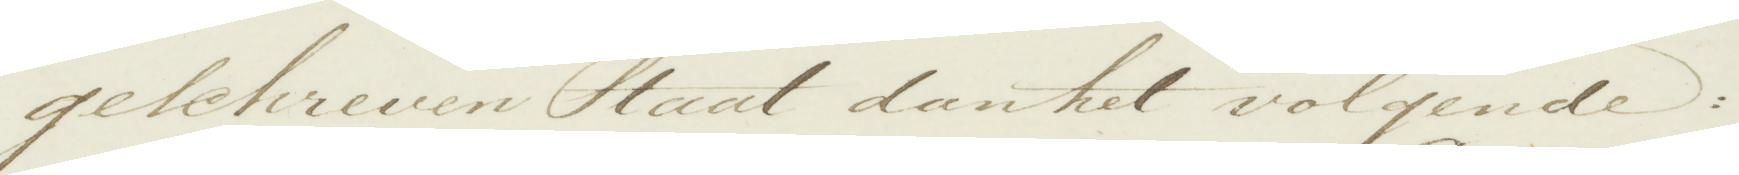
geschreven staat dan het volgende:
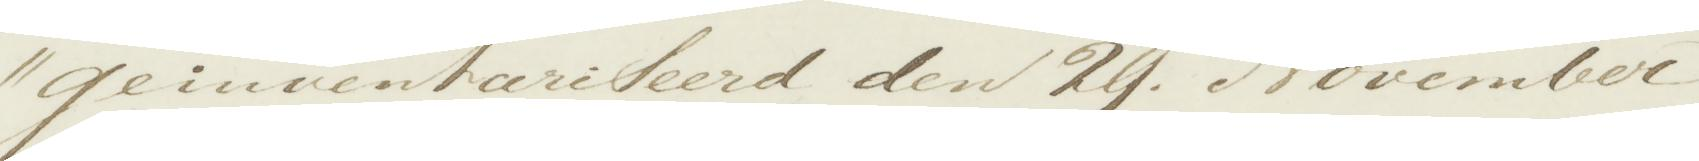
geinventariseerd den 29. November
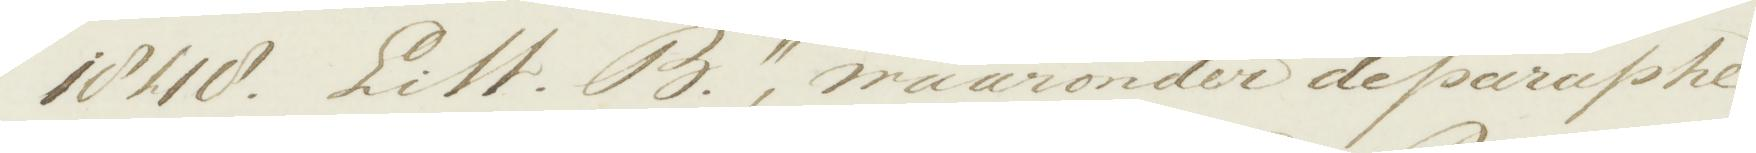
1848. Litt. B.", waaronder de paraphe
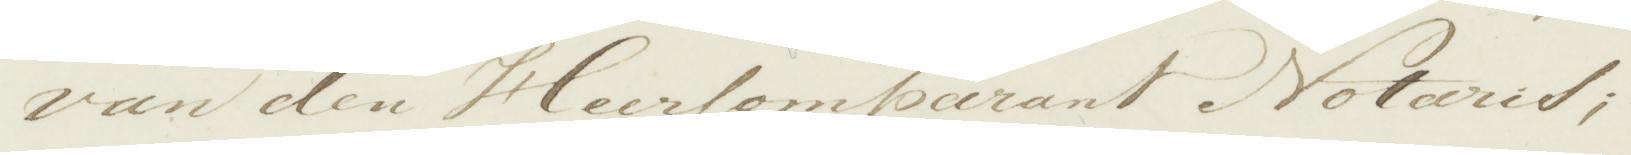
van den Heer Comparant Notaris;
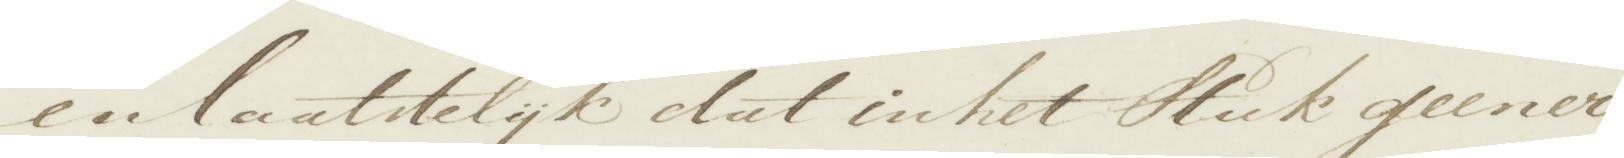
en laatstelijk dat in het stuk geener
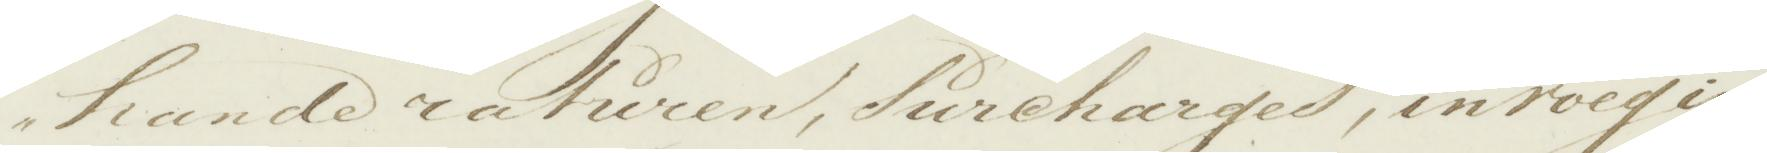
„hande raturen, surcharges, invoegin
